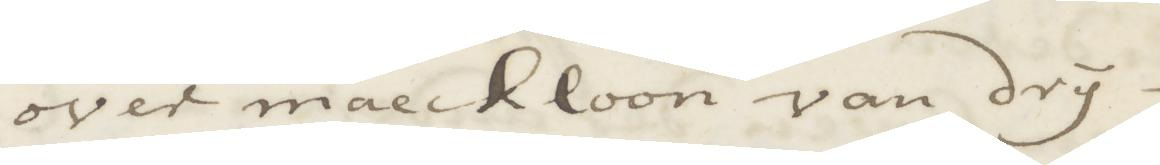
over maeckloon van drij —
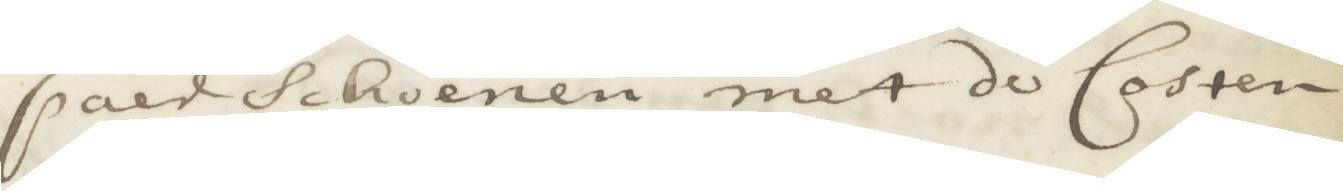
paer schoenen met de Costen
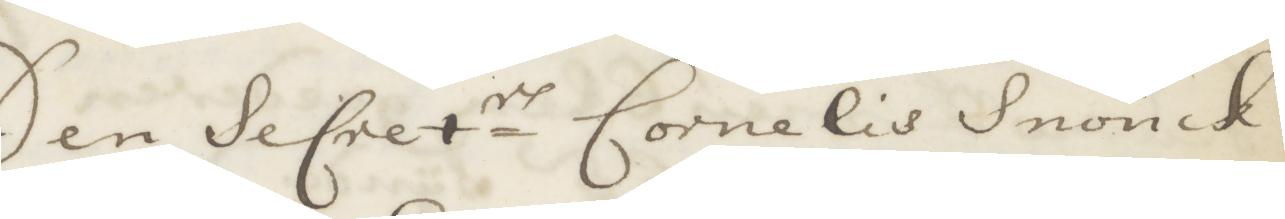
Den secret=rs Cornelis Snouck
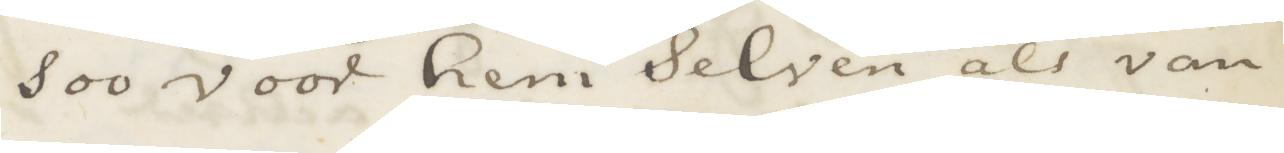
soo voor hem selven als van
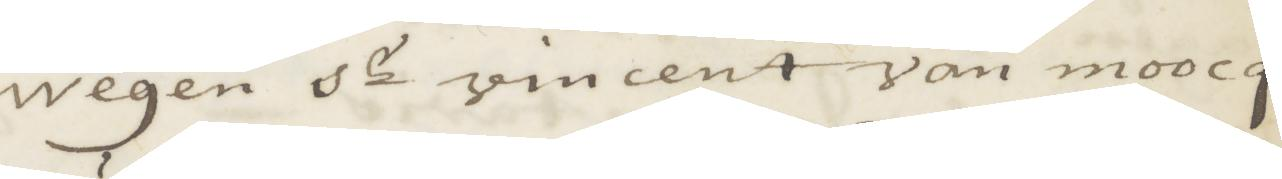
wegen s=r vincent van moocq
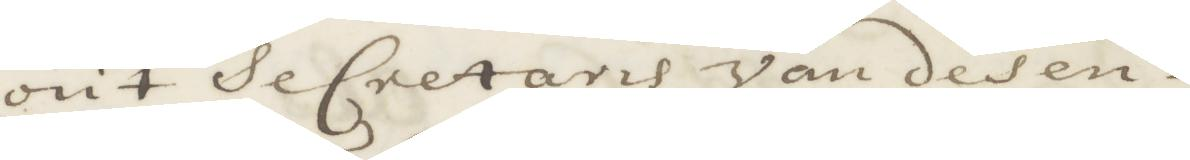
out secretaris van desen —
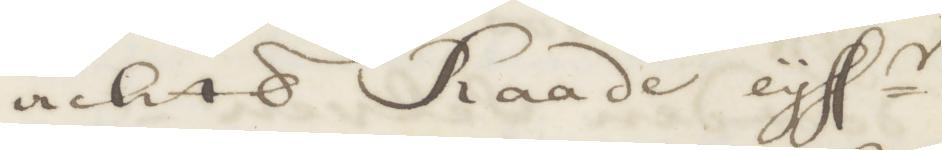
achtb Raade eijss=r
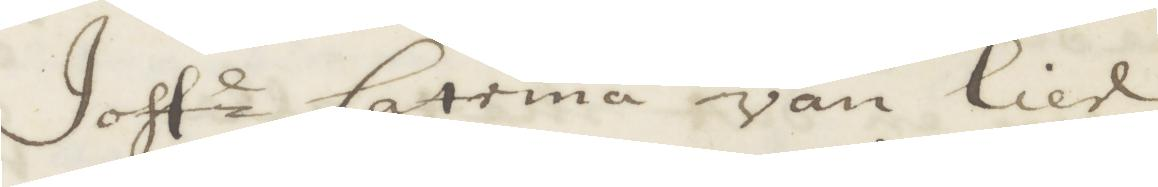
Ioff=e Catrina van Lier
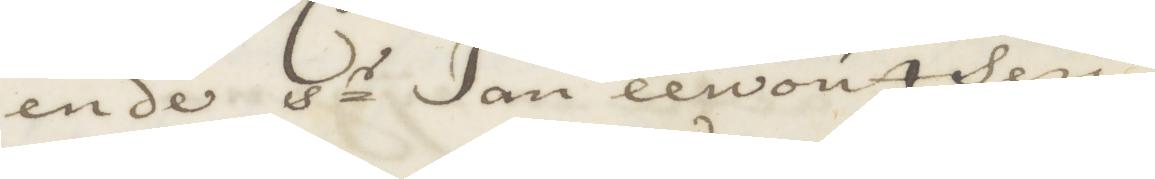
ende s=r Ian eewoutsen
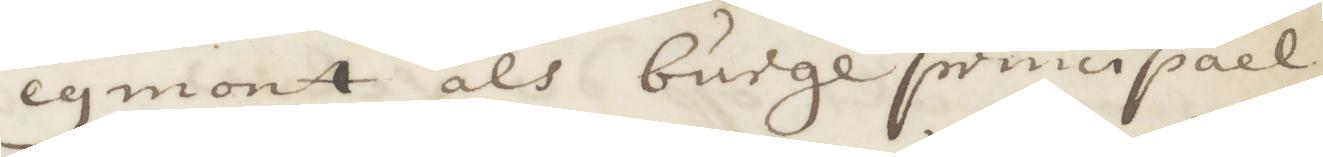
egmont als burge principael
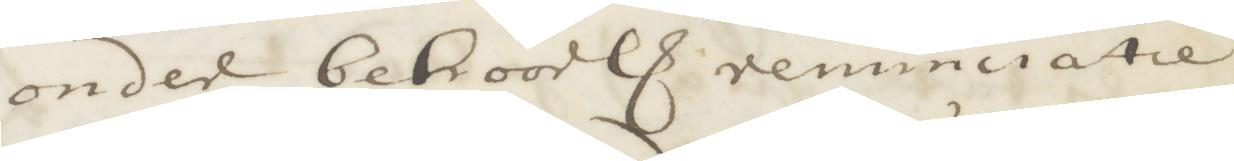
onder behoorl renunciatie
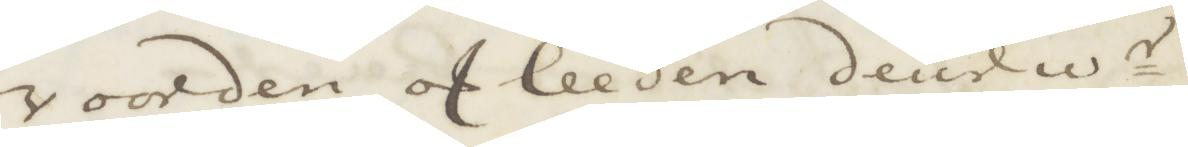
voorden overleeden deurw=r
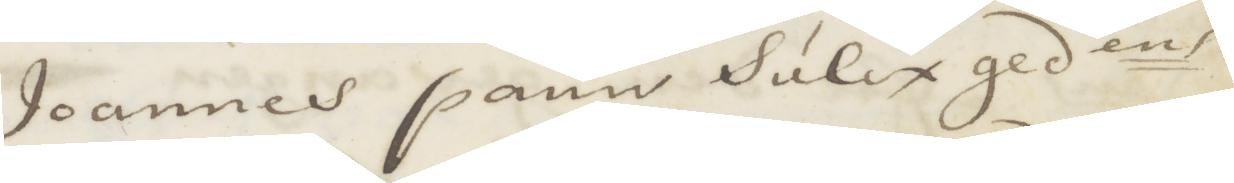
Ioannes pauw sulcx ged=ens
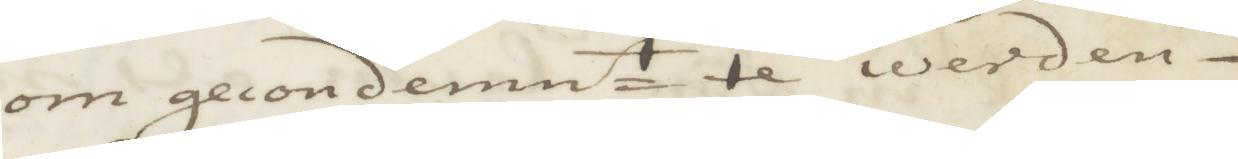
om gecondemn=t te werden —
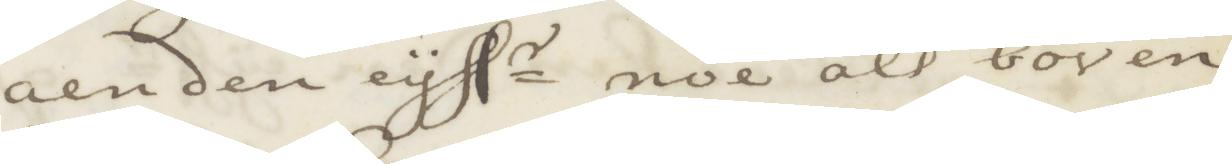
aen den eijss=r noe als boven
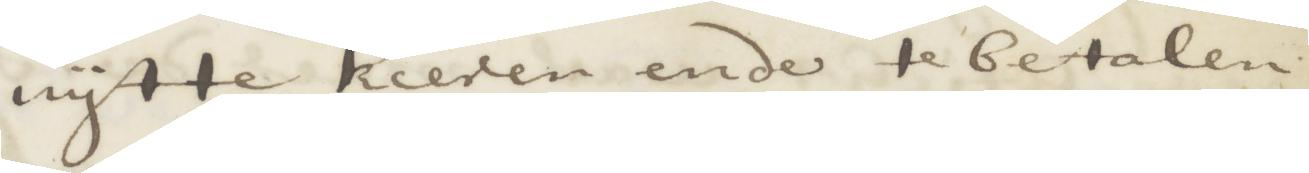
uijtte keeren ende te betalen
